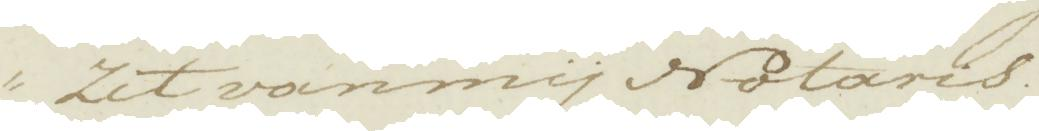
„zit van mij Notaris.
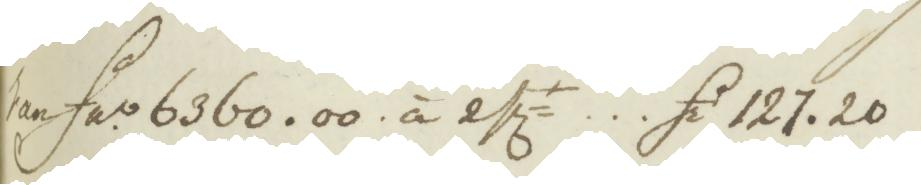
Van fr. 6360.00. à 2 pr=t ... fr 127.20
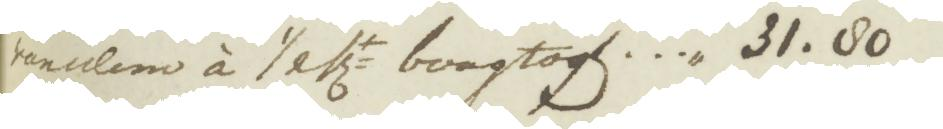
vanulem à ½ pr=t borgtogt ... „ 31.80
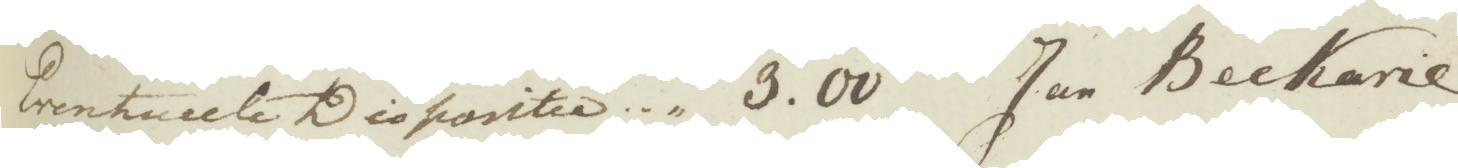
Eventueele Dispositien .. „ 3.00 Jan Beckarie
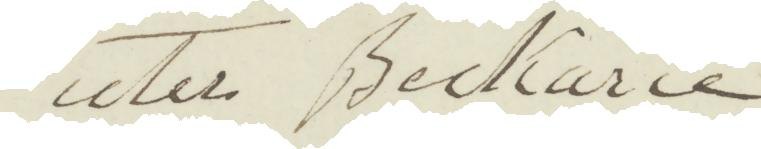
Pieter Beckarie
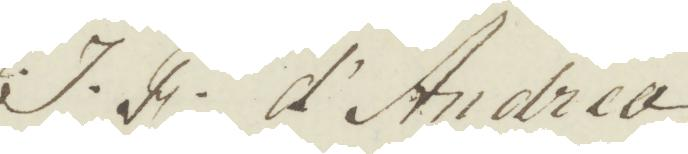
J. F. d’ Andrea
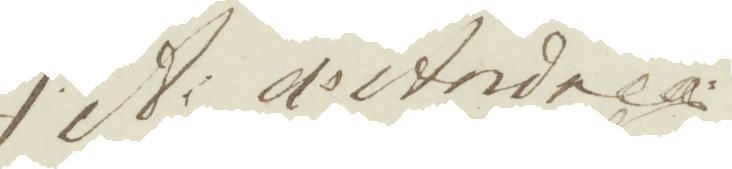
J: A: d' Andrea:
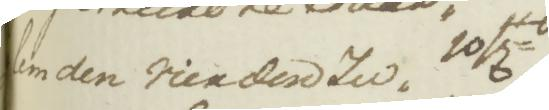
lem den vierden Iu„ 10 pr=t
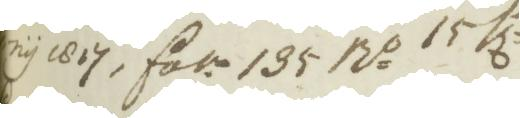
nij 1817, fol. 135 n=o 15 pr
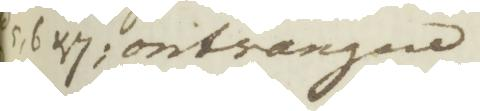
5, 6 & 7; ontvangen
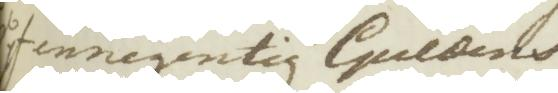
vijfennegentig Guldens
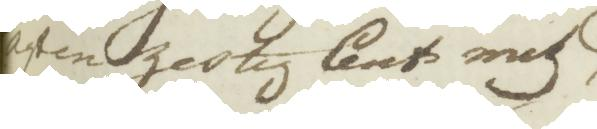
Agten Zestig Cent met
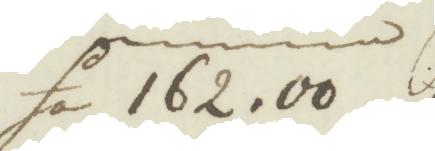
fr 162.00
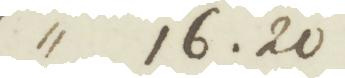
„ 16.20
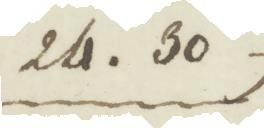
24.30 -
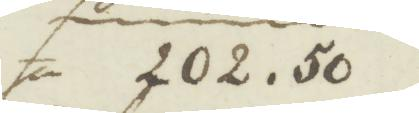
fr 202.50
